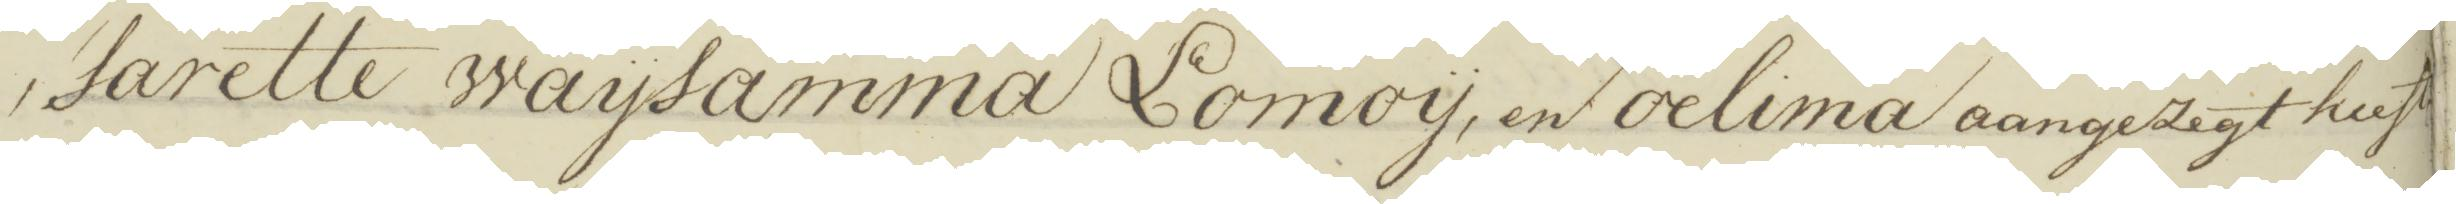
„sarette Waijsamma Lomoij, en oelima aangezegt heeft
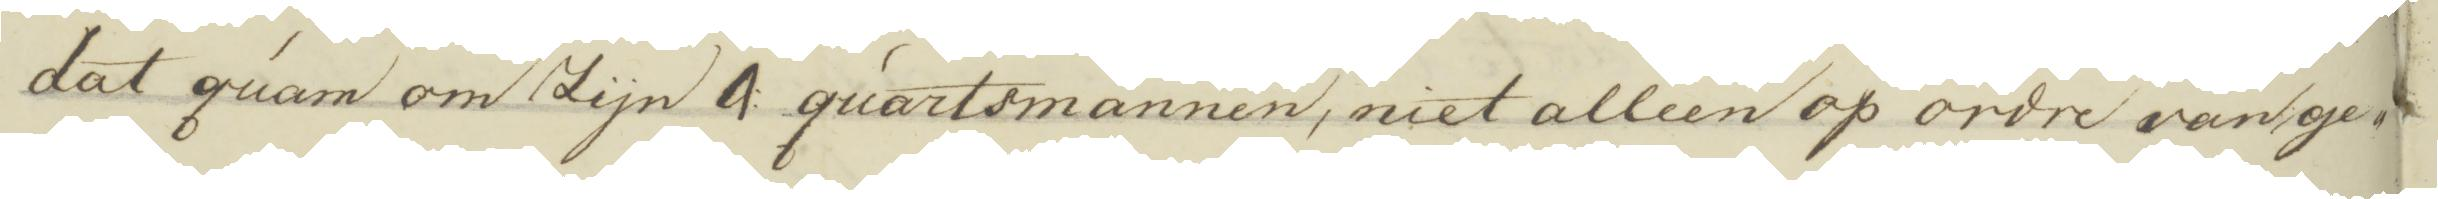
dat quam om Zijn 4: quartsmannen, niet alleen op ordre van ge„
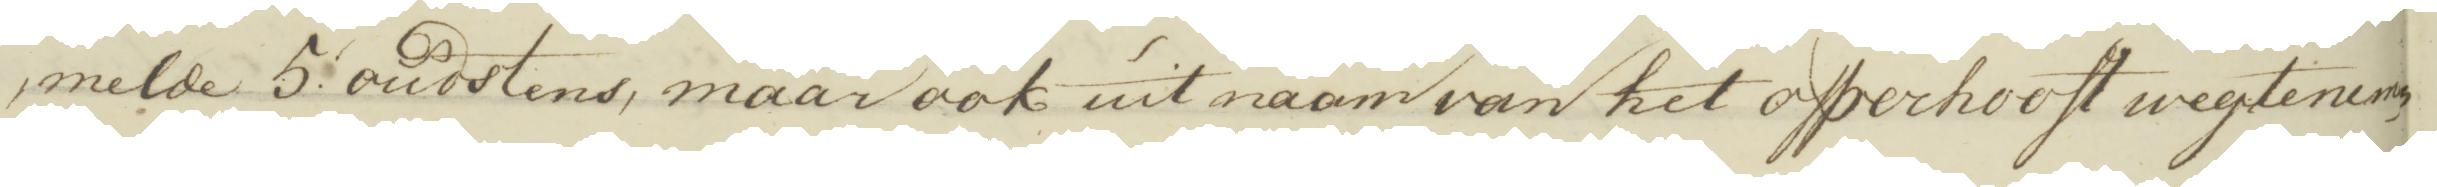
„melde 5: oudstens, maar ook uit naam van het opperhooft weg te nemen
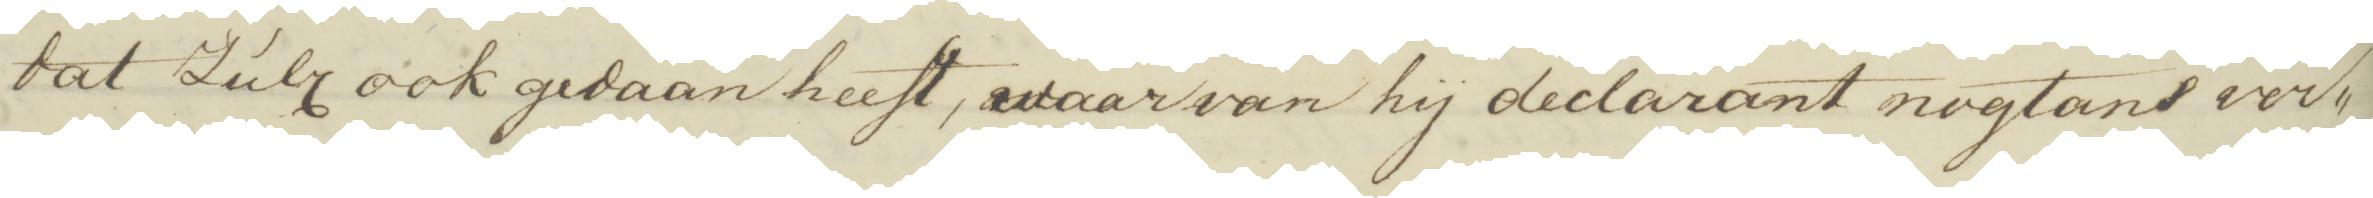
dat Zulx ook gedaan heeft, waar van hij declarant nogtans ver„
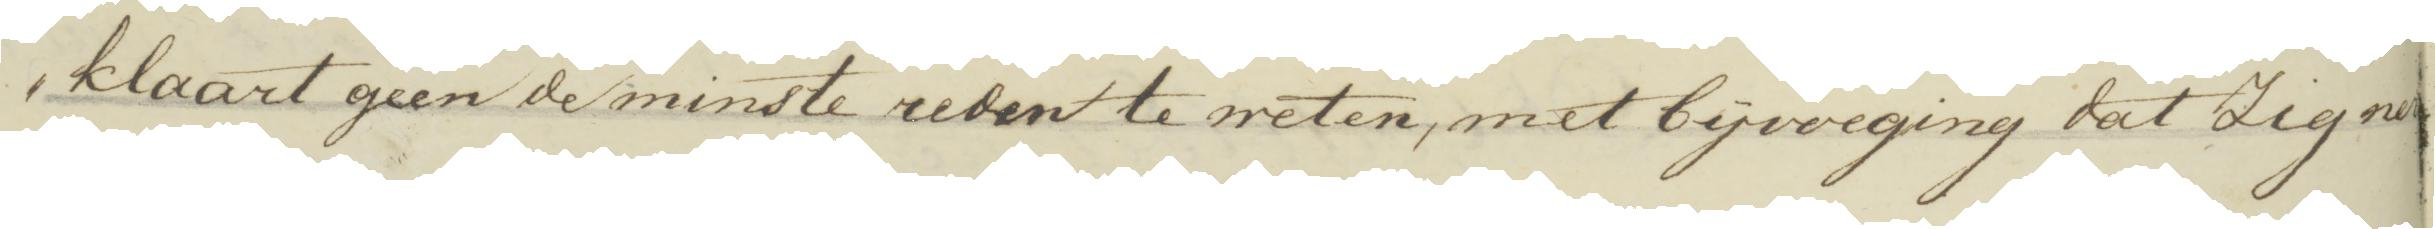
„klaart geen de minste reden te weten, met bijvoeging dat Zig ner„
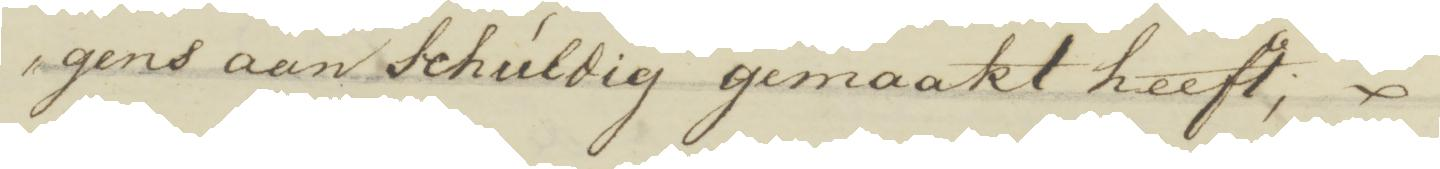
„gens aan schuldig gemaakt heeft;~
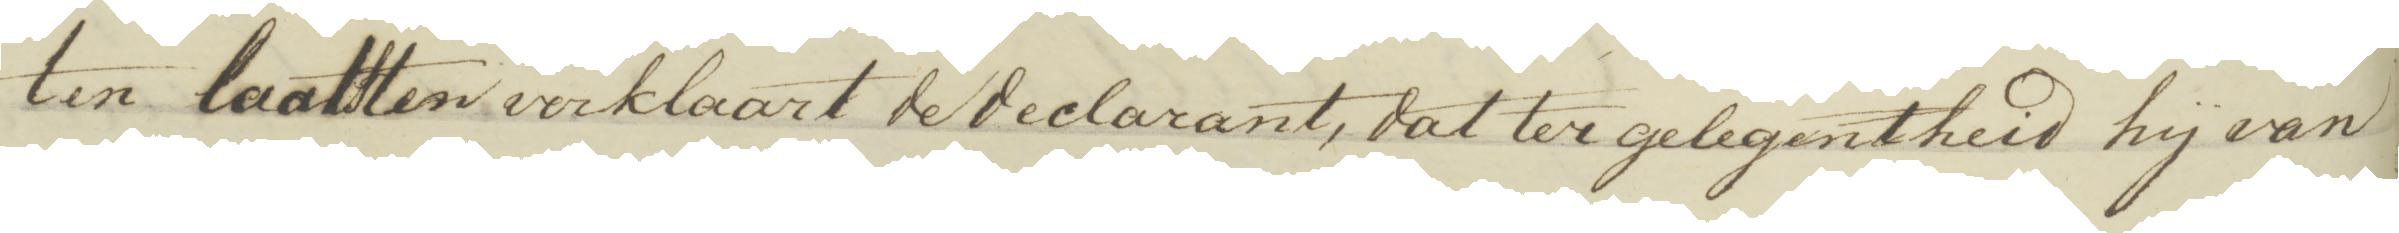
ten laatsten verklaart de declarant, dat ter gelegentheid hij van
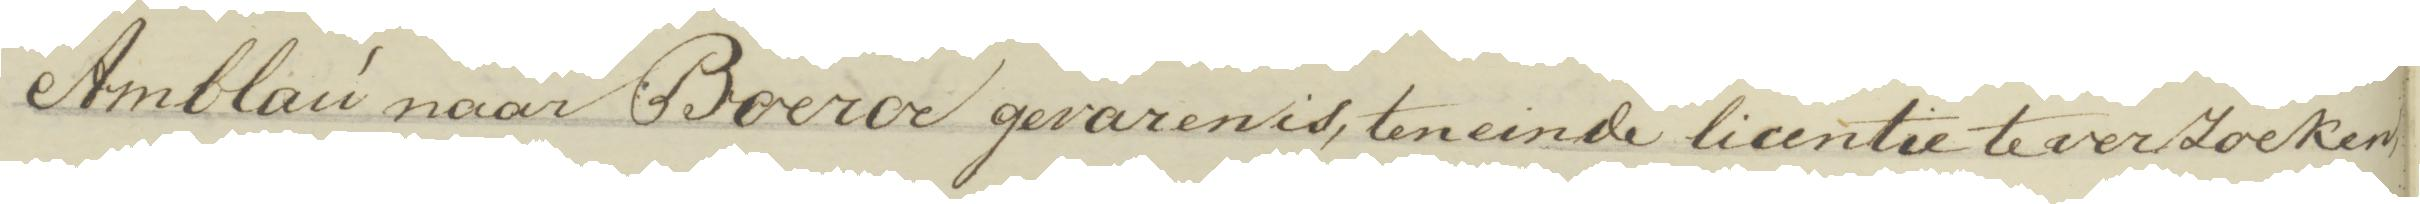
Amblau naar Boeroe gevaren is, ten einde licentie te verzoeken,
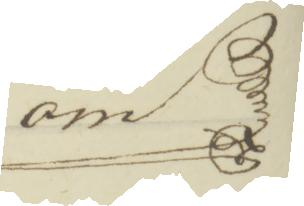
om ~
